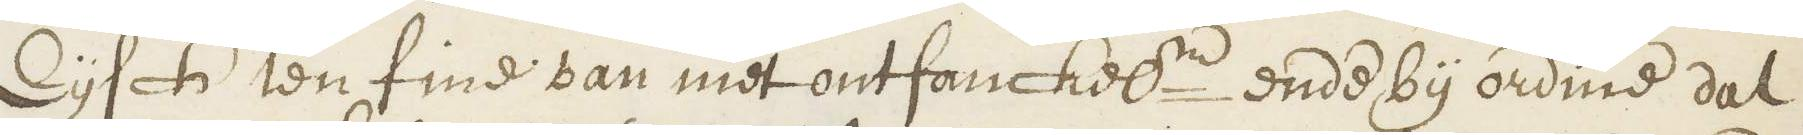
Eijsch ten fine van met ontfanckel= ende bij ordine dat
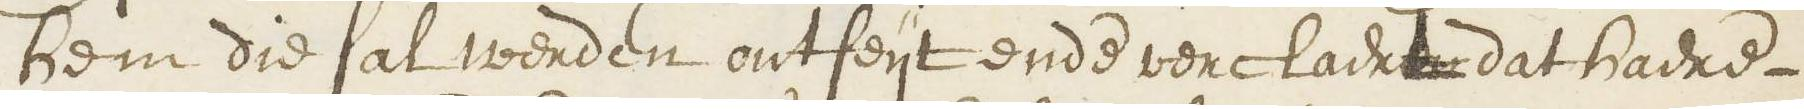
hem die sal werden ontseijt ende verclaeren dat haere—
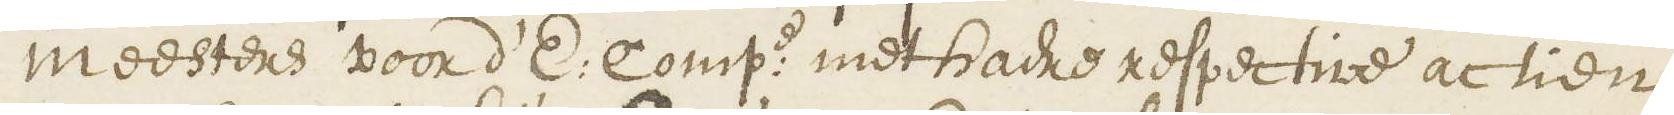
meesters voor d’ E: Comp:e met haere respective actien
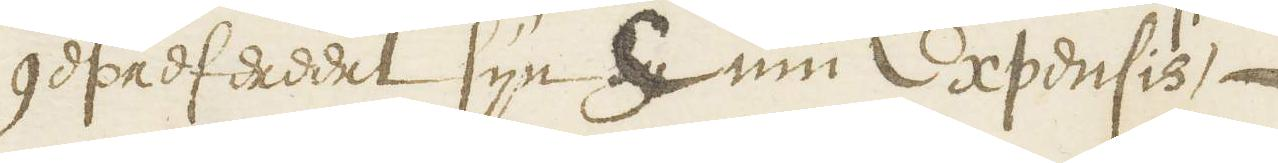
geprefereert sijn Cum Expensis—
